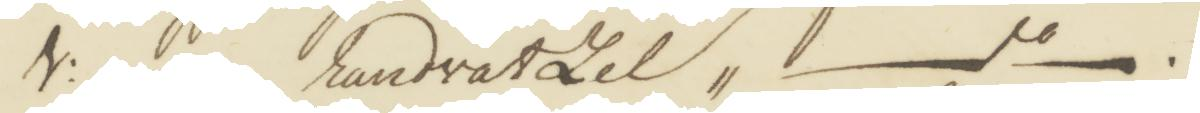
1: „ „ handvatzel „ d-o .
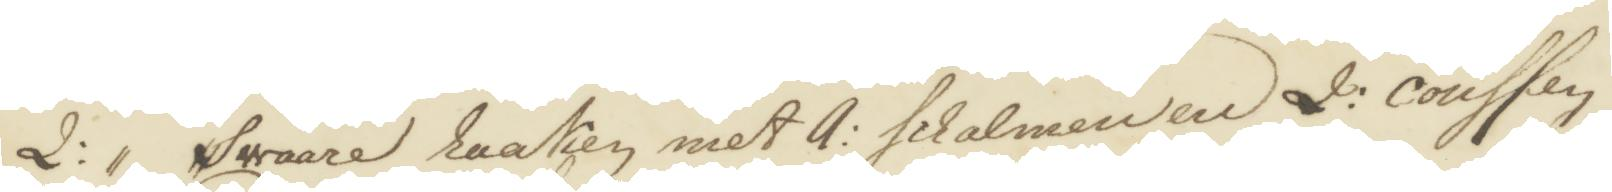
2: „ swaare haaken met 4: schalmen en 2: coussen
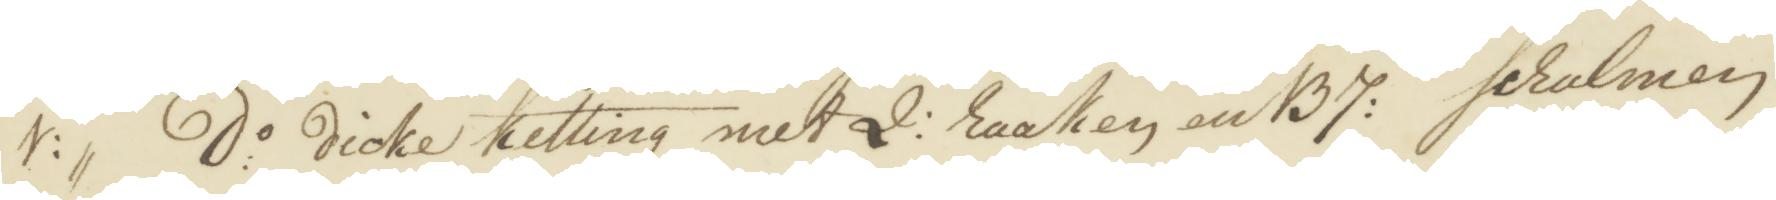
1: „ d:o dicke ketting met 2: haaken en 137: schalmen
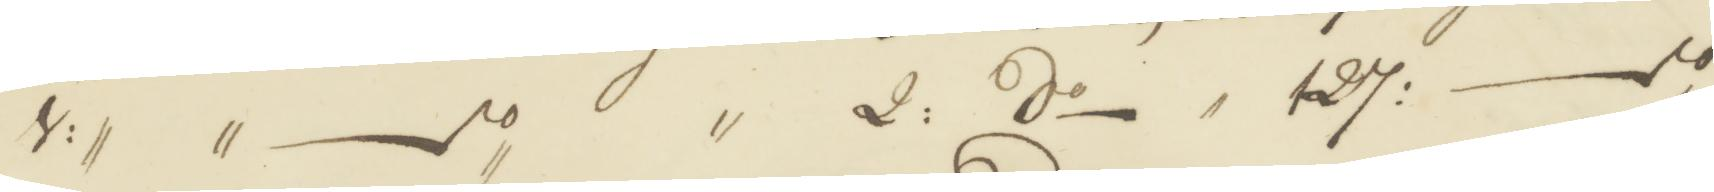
1: „ „ d„o „ 2: d-o „ 127: d„o
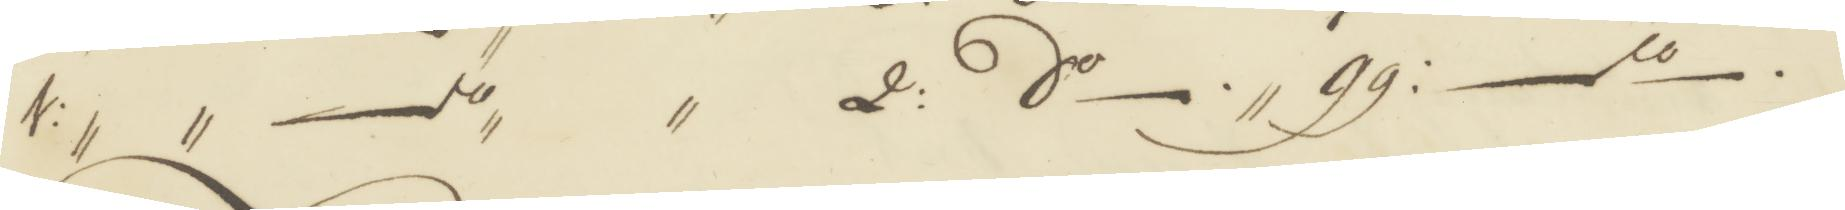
1: „ „ d„o „ 2. d-o . „ 99: d-o .
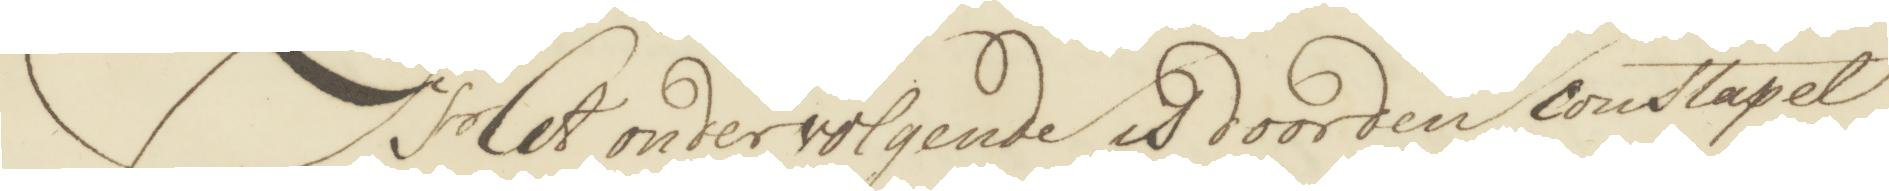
Het ondervolgende is doorden Constapel
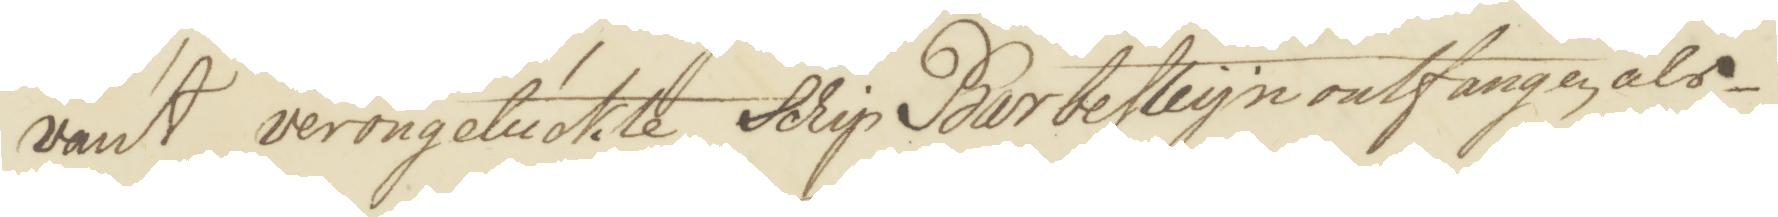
van't verongeluckte schip Barbesteijn ontfangen als
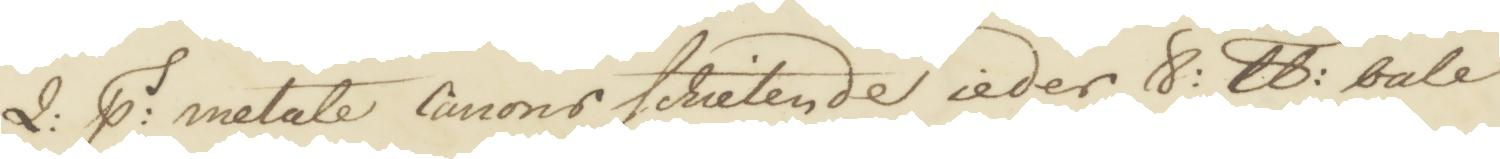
2: p:s metale Canons schietende ieder 8: lb: bale
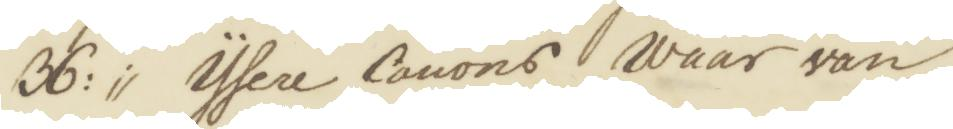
36: „ ijsere Canons waar van
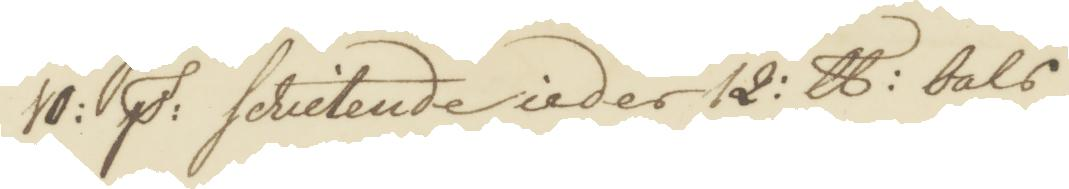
10: p:s schietende ieder 12: lb: bals
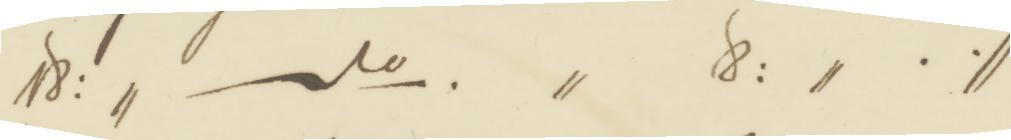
18: „ d-o . „ 8: „ - - „
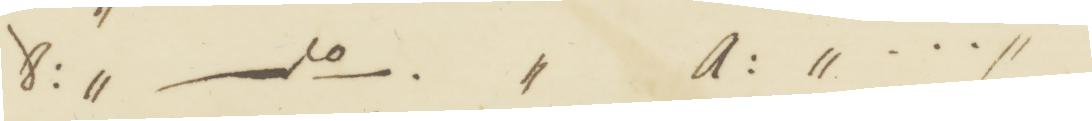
8: „ d-o „ 4: „ - - - „
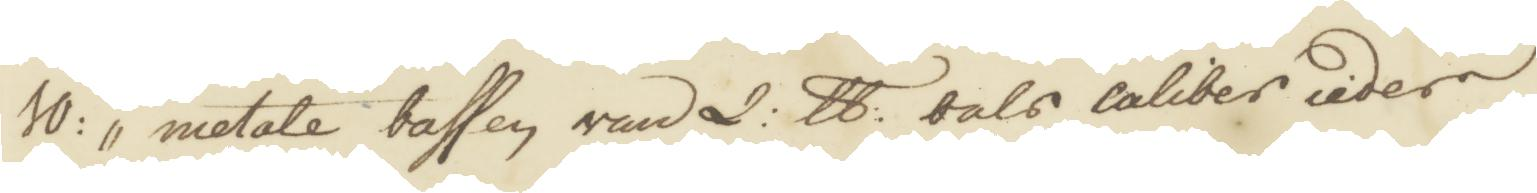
10: „ metale bassen van 2: lb: bals caliber ieder
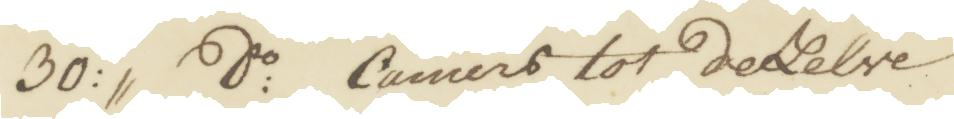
30: „ d:o Camers tot dezelve
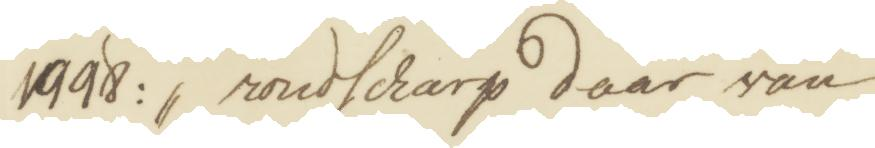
1448: „ rondscharp daar van
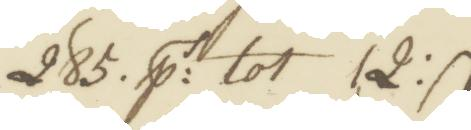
285. p:s tot 12:
